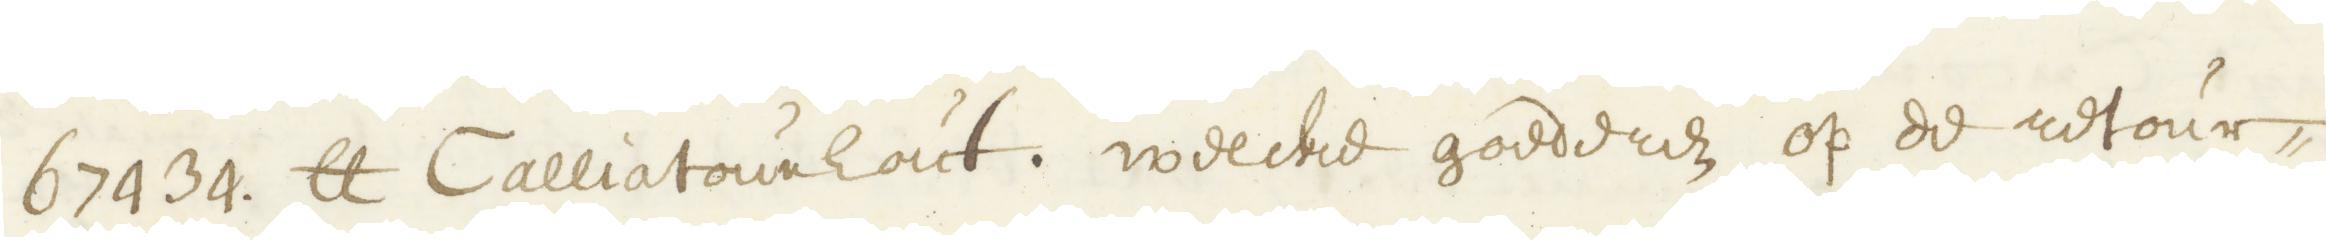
67434. lb Calliatourhout. welcke goederen op de retour„
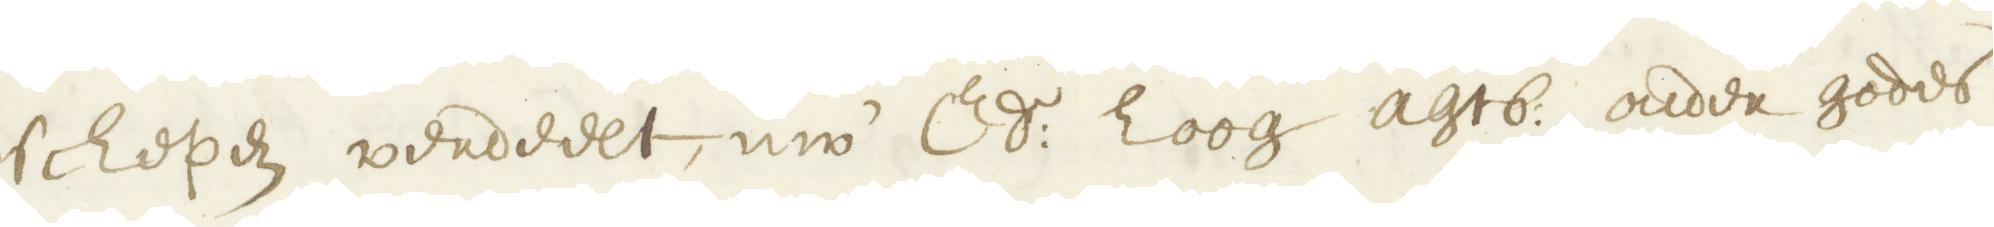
schepen verdeelt, uw Ed: hoog agtb: onder godes
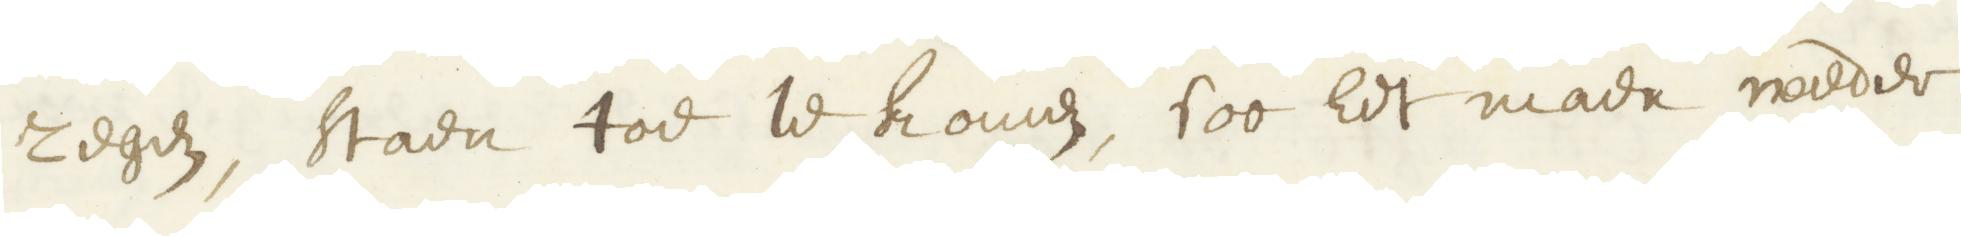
zegen, staen toe te konnen, soo het maer weder
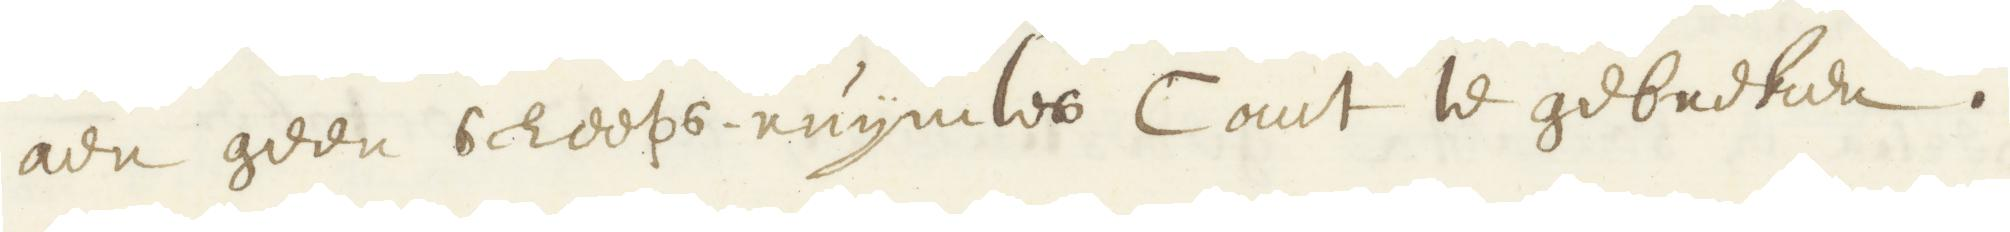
aen geen scheeps-ruijmtes Comt te gebreken.
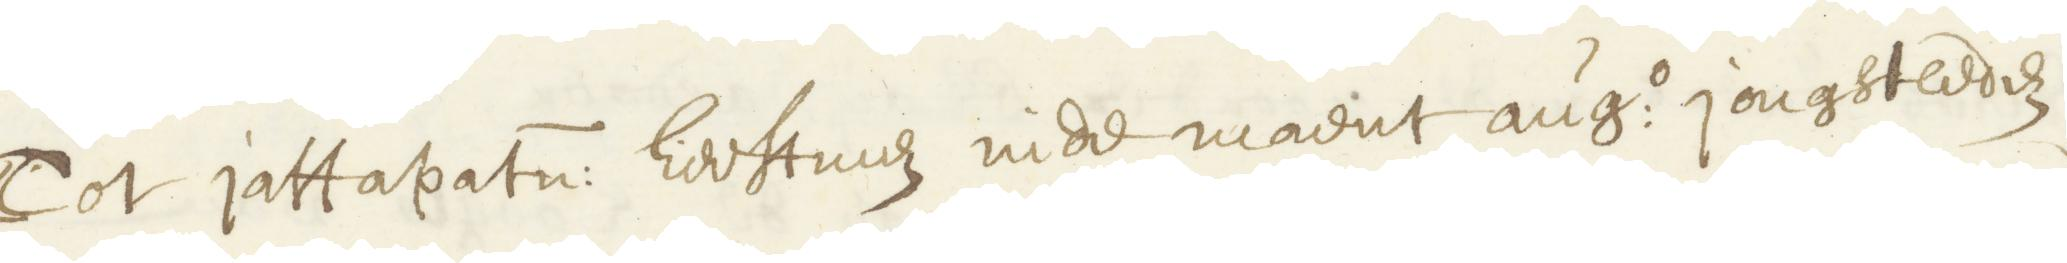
Tot jaffapatn: heeftmen inde maent aug:o jongstleden
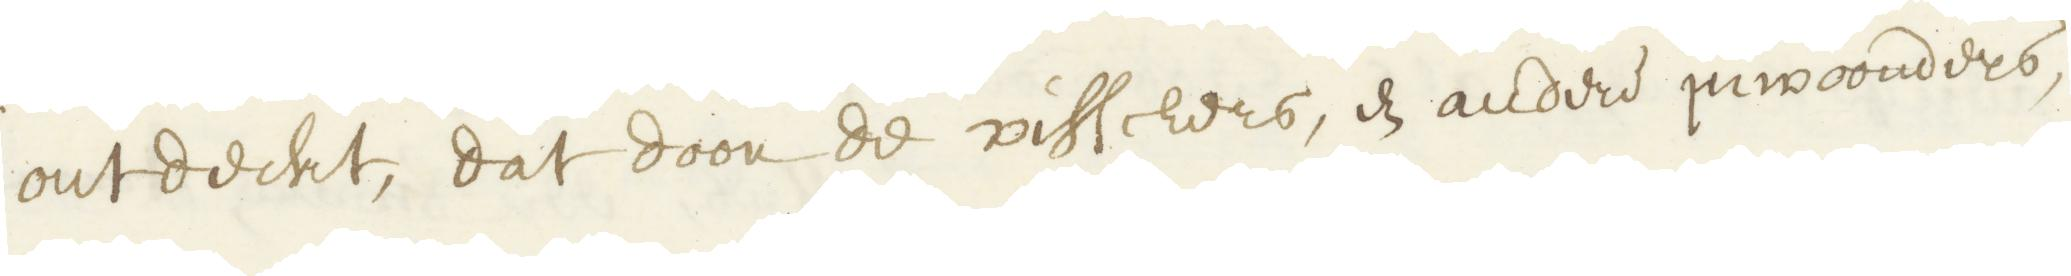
ontdeckt, dat door de visschers, en andere inwoonders,
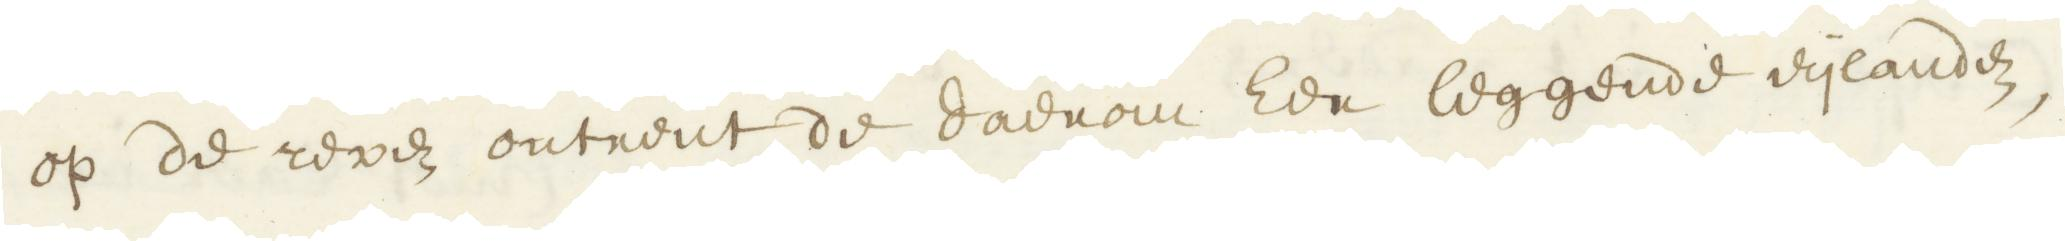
op de reven ontrent de daerom her leggende eijlanden,
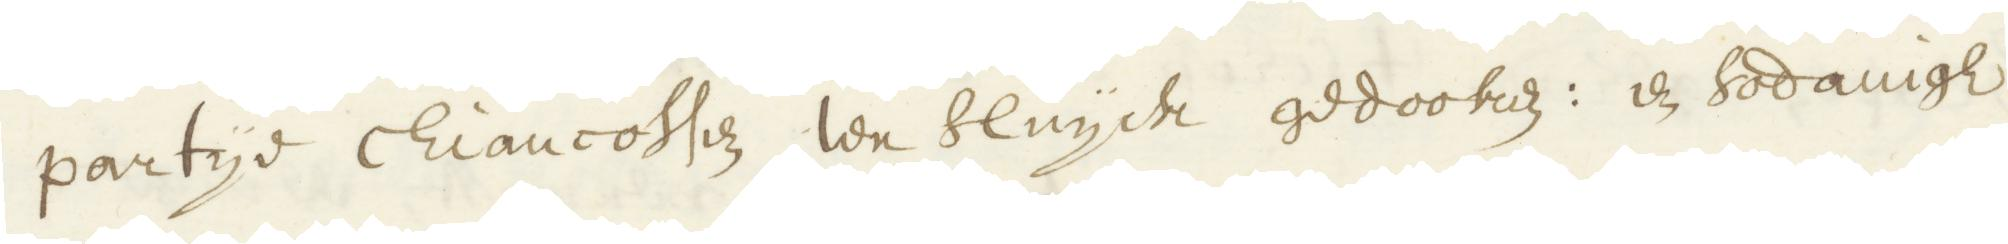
partije chiancossen ter sluijck gedooken: en sodanigh
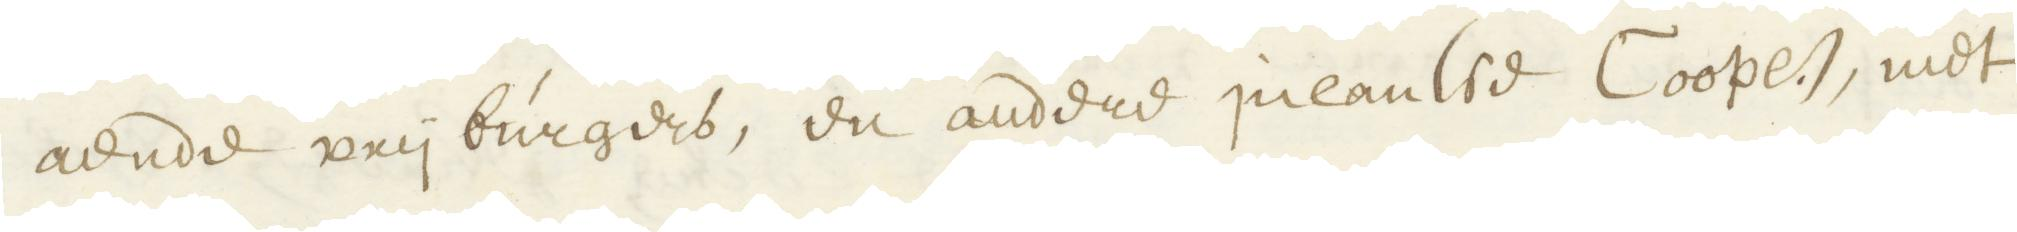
aende vrij burgers, en andere inlantse Cooplijk, met
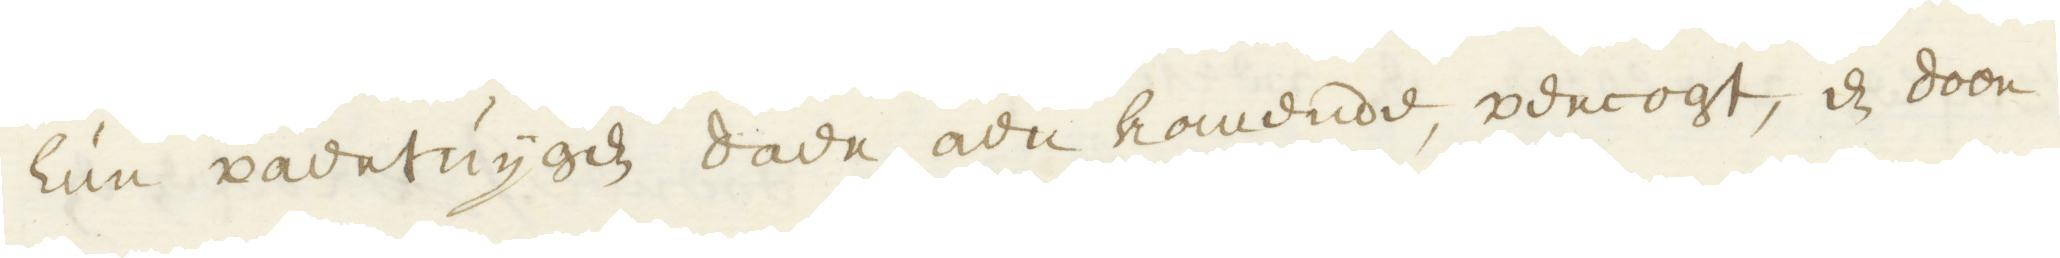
hun vaertuijgen daer aen komende, vercogt, en door
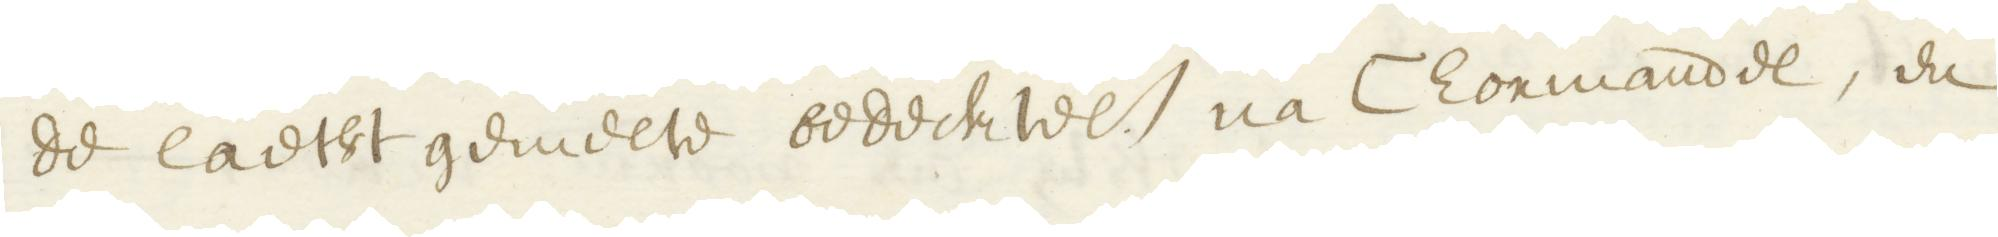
de laetst gemelte bedecktelijk na Chormandel, en
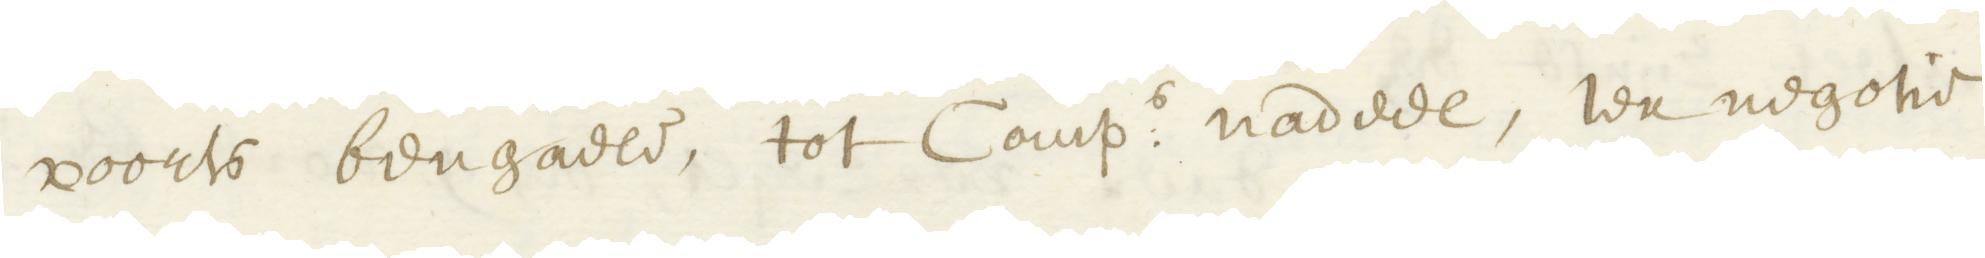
voorts bengaele, tot Comp:s nadeel, ter negotie
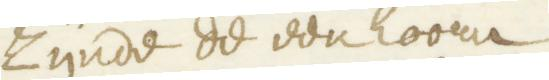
zijnde de eenhoorn
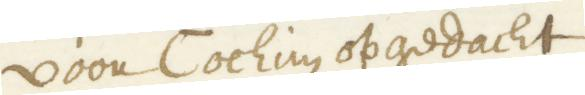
voor Cochim opgedacht
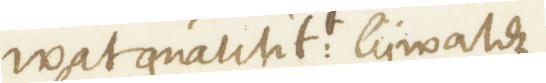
wat qualitit:t lijwaten
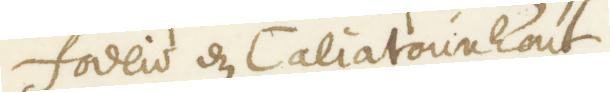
foelie en Caliatourhout
